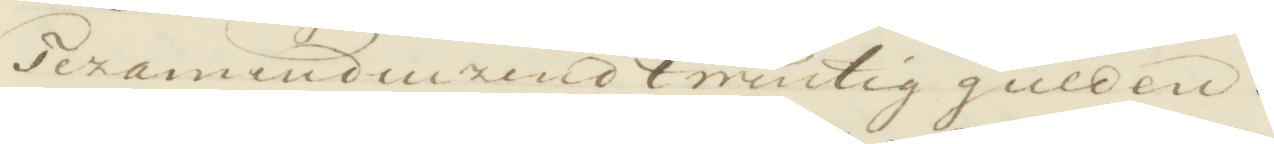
Tezamen duizend twintig gulden —
